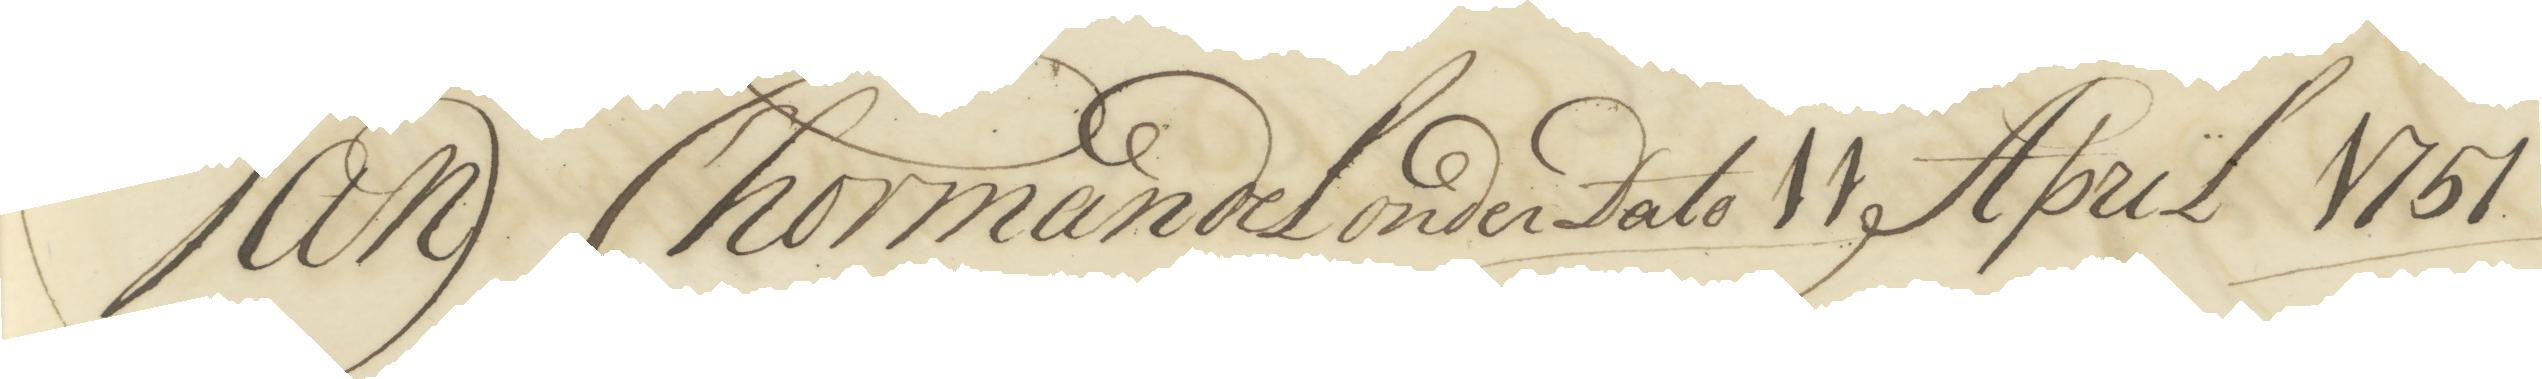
Van Chormandel onder Dato 11 April 1751
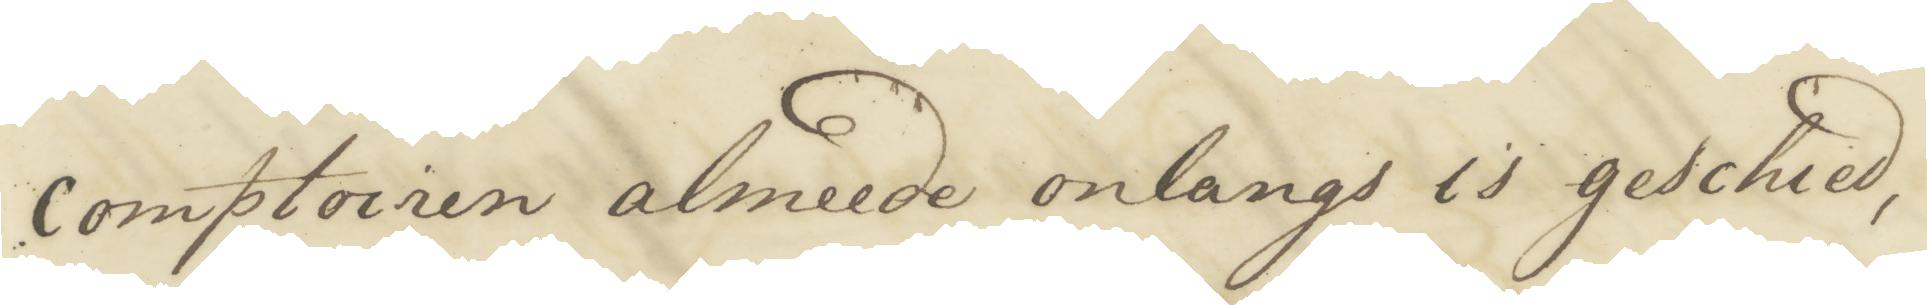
comptoiren almeede onlangs is geschied,
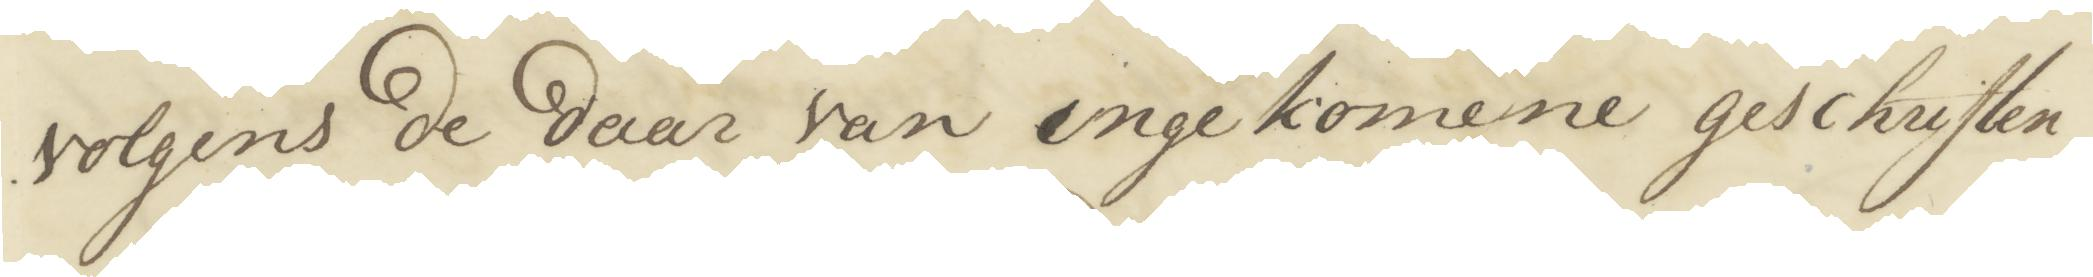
volgens de daar van ingekomene geschriften
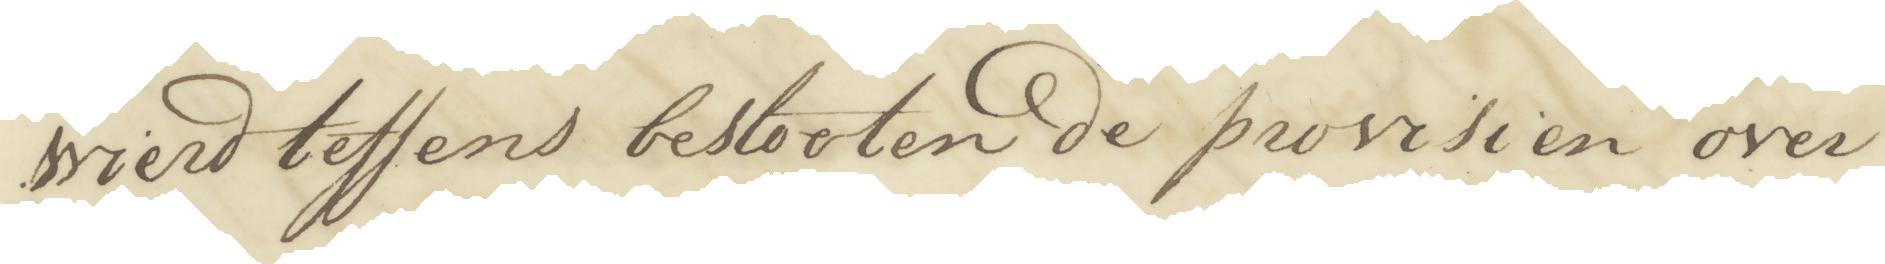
wierd teffens beslooten de provisien over
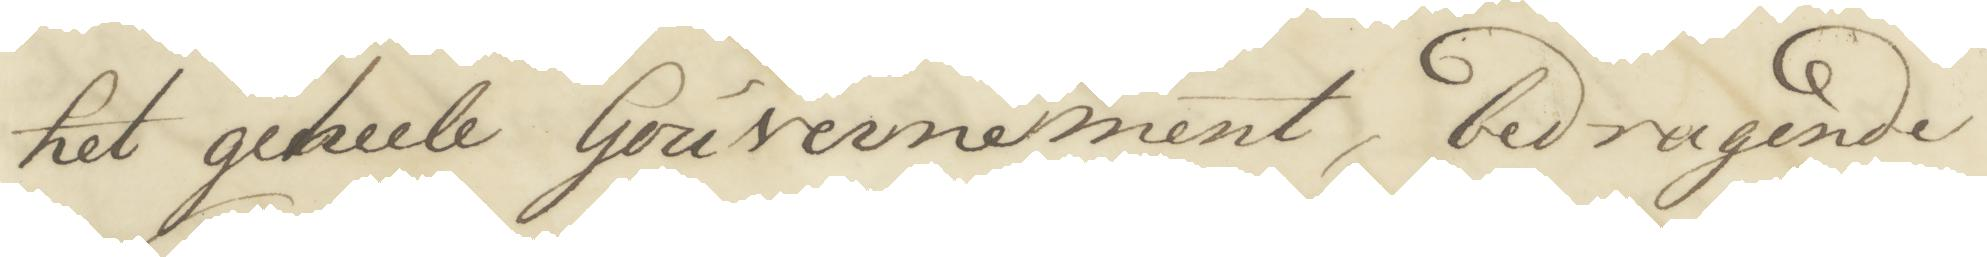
het geheele Gouvernement, bedragende
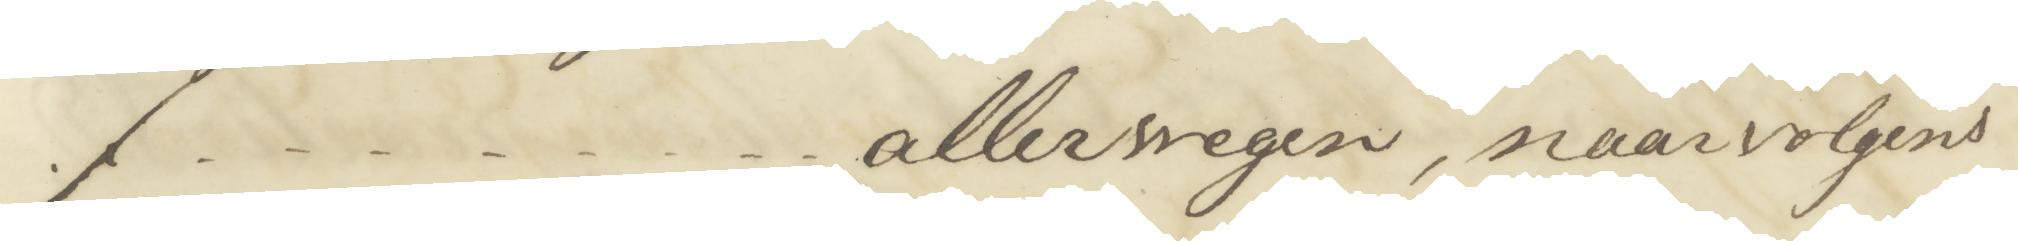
ƒ - - - - - - - - aller wegen, naar volgens
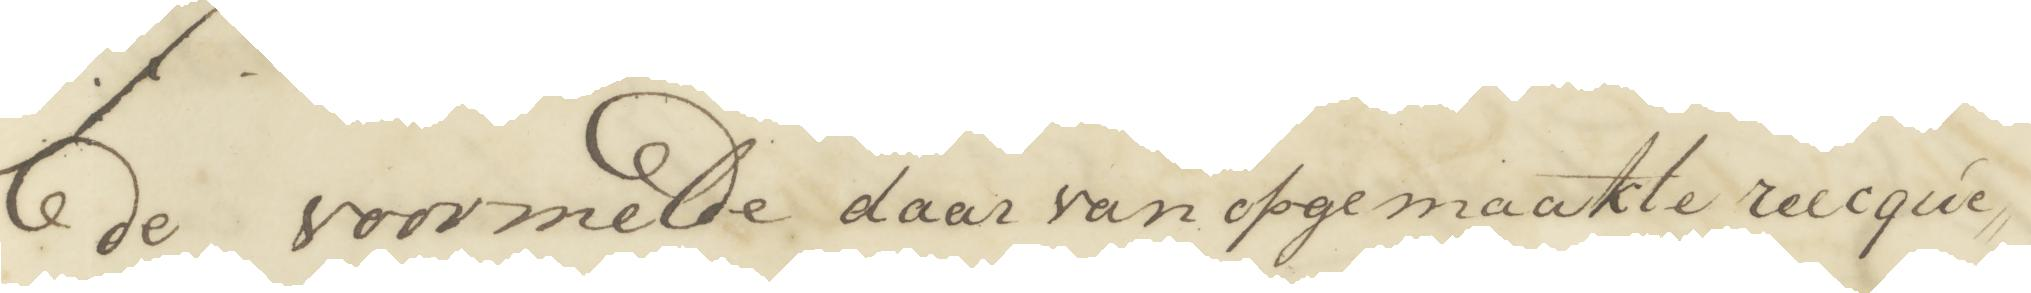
de voormelde daar van opgemaakte reecque„
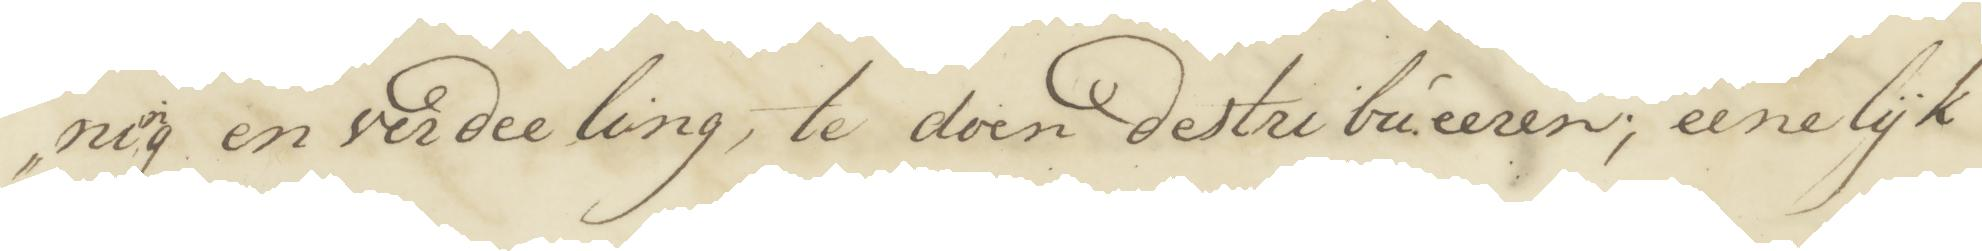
„ning en verdeeling, te doen destribueeren; eenelijk
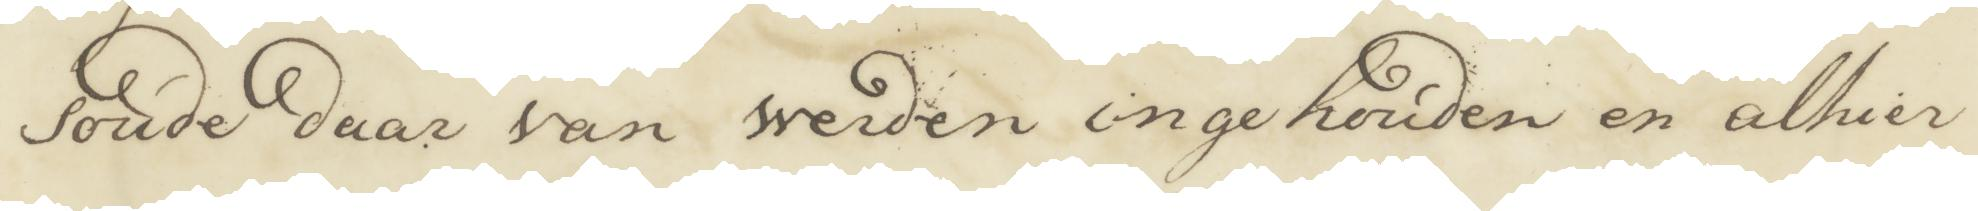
soude daar van werden ingehouden en alhier
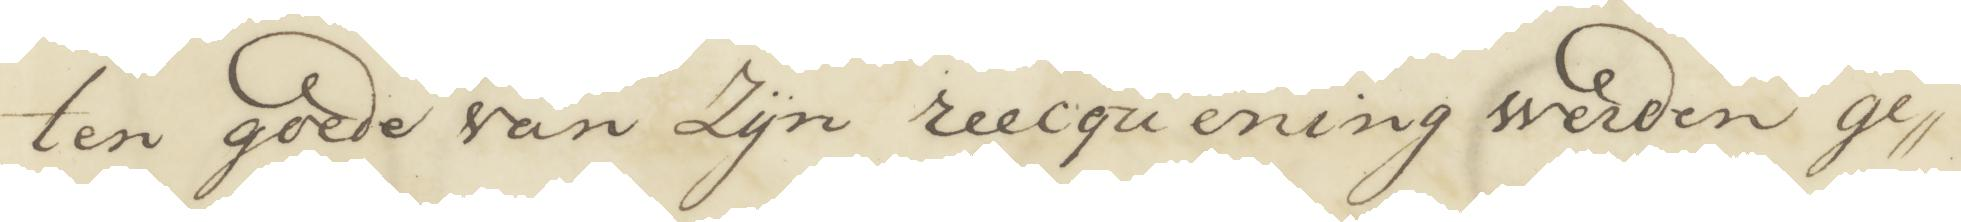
ten goede van zijn reecquening werden ge„
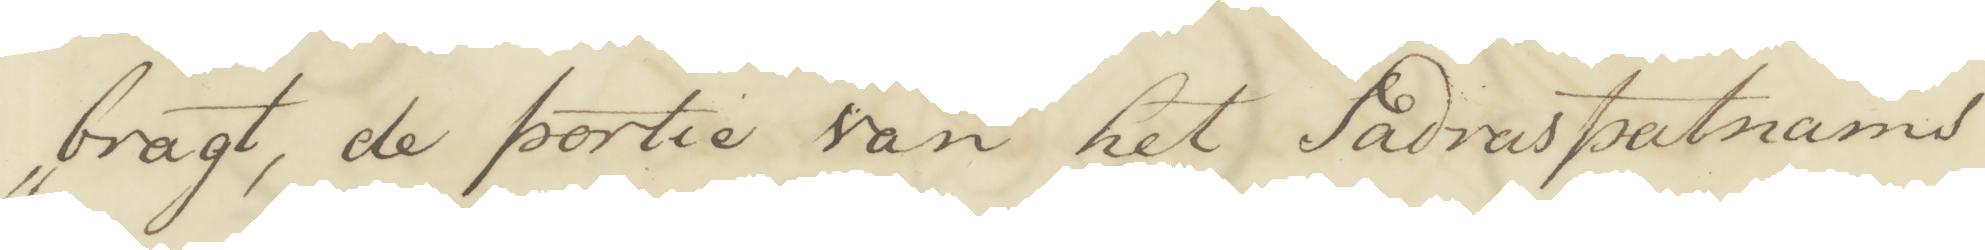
„bragt, de portie van het sadraspatnams
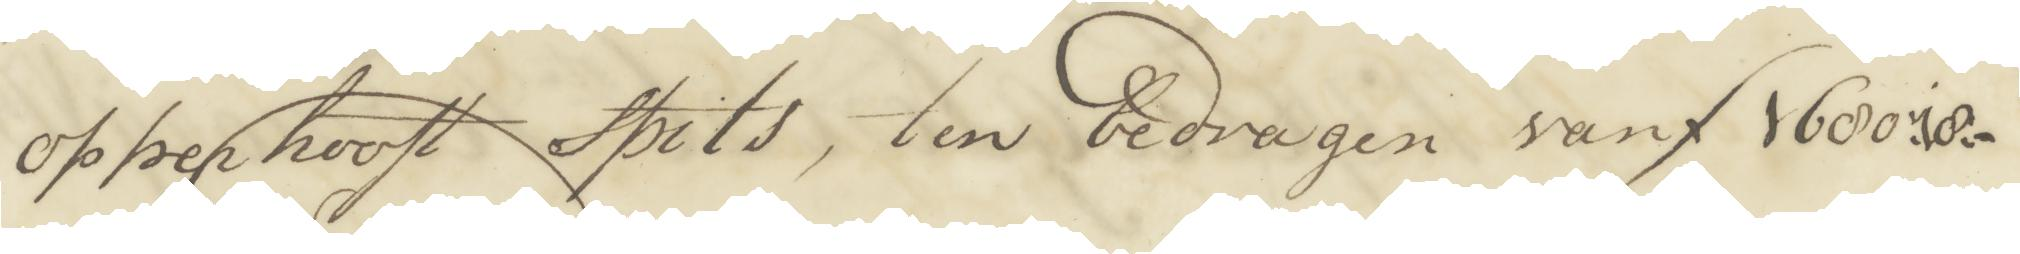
opperhooft spits, ten bedragen van ƒ 1680:18:-
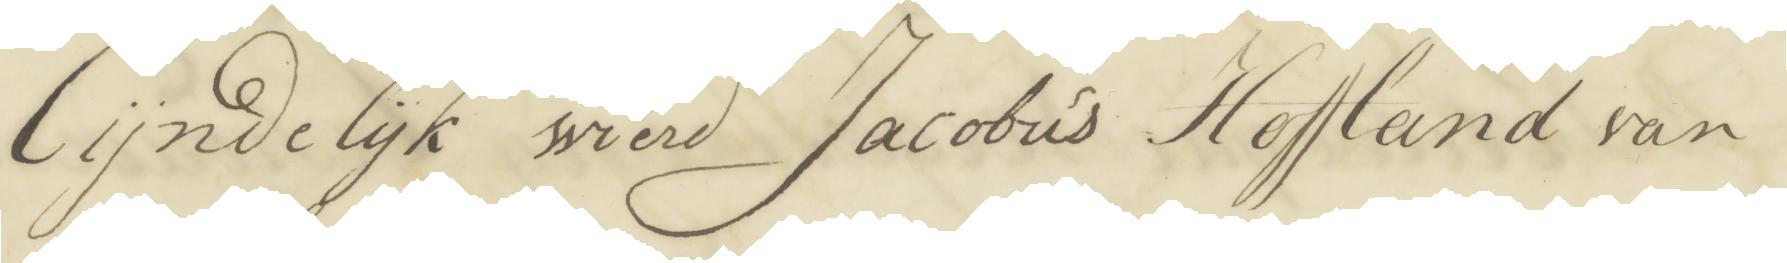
Eijndelijk wierd Jacobus Hoffland van
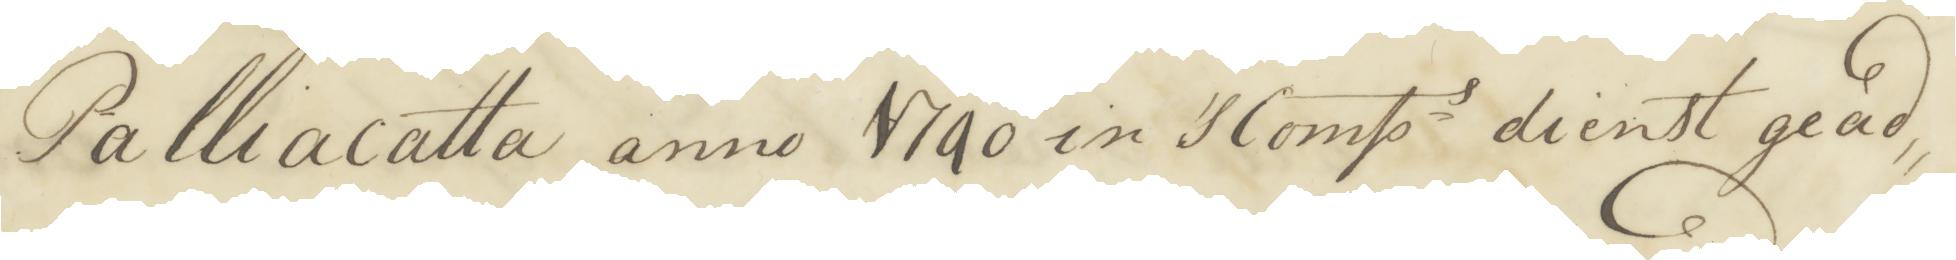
Palliacatta anno 1740 in ’sComp=s dienst gead„
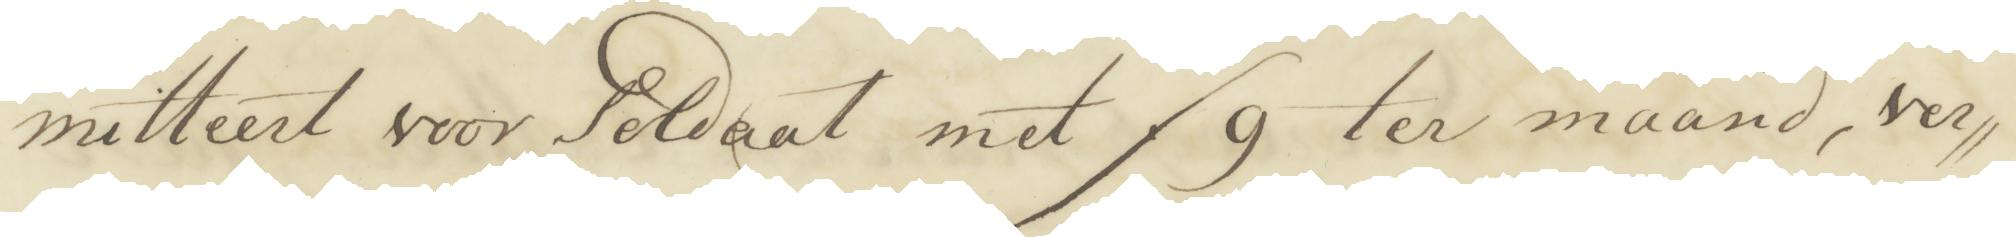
mitteert voor soldaat met ƒ 9 ter maand, ver„
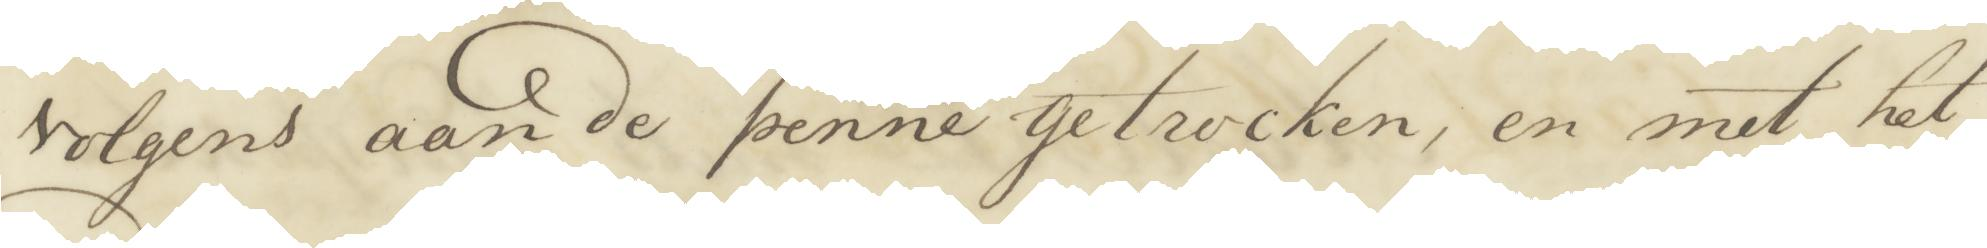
volgens aan de penne getrocken, en met het
